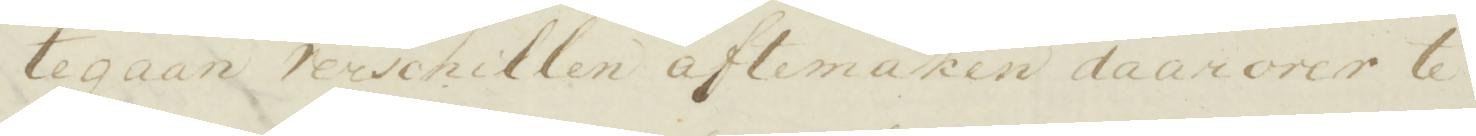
te gaan verschillen aftemaken daar over te
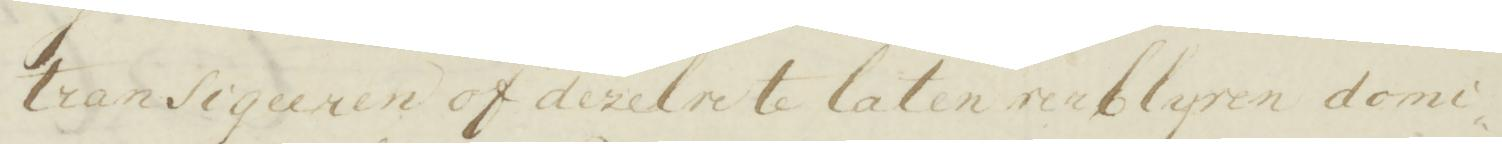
transigeeren of dezelve te laten verblyven domi„
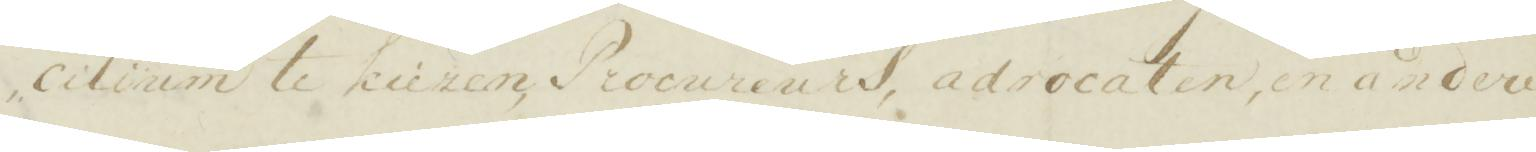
„cilium te kiezen, Procureurs, advocaten, en andere
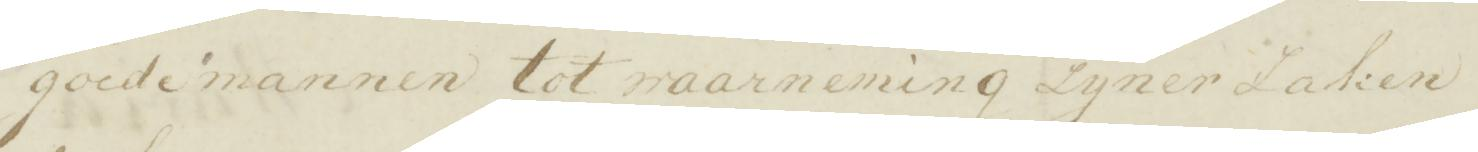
goede mannen tot waarneming zyner Zaken
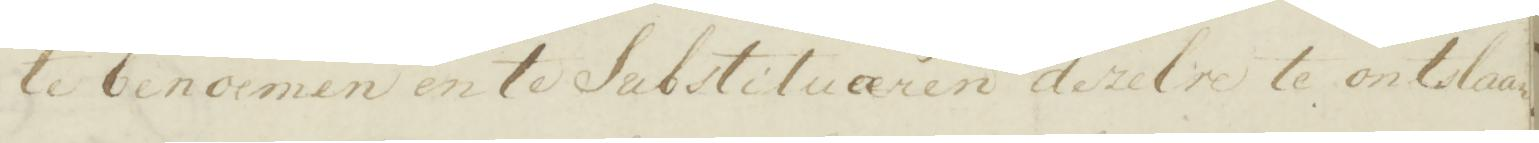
te benoemen en te substitueeren dezelve te ontslaan
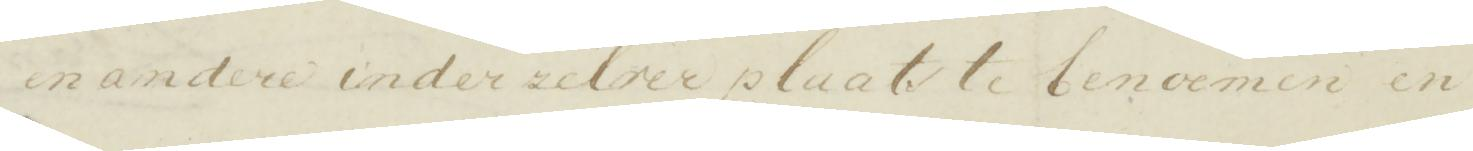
en andere in der zelver plaats te benoemen en
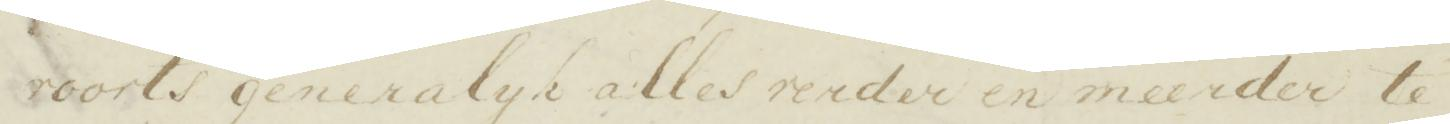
voorts generalyk alles verder en meerder te
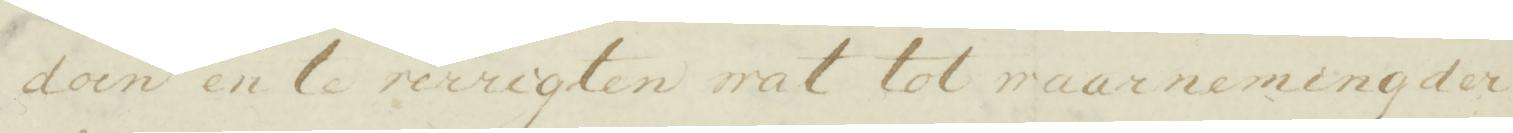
doen en te verrigten wat tot waarneming der
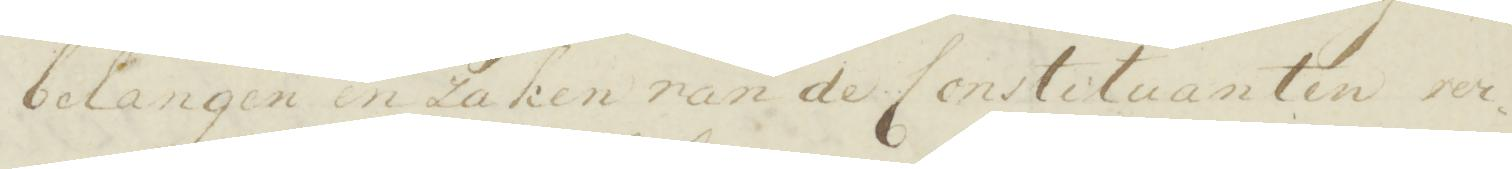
belangen en zaken van de Constituanten ver„
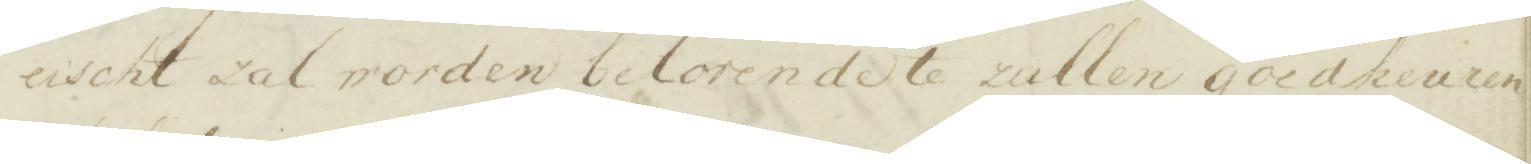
eischt zal worden belovende te zullen goedkeuren
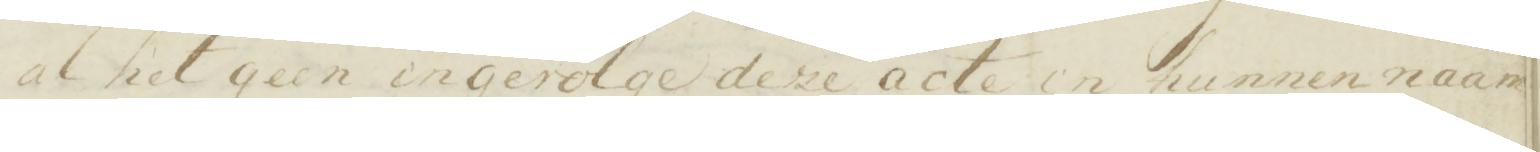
al het geen ingevolge deze acte in hunnen naam
